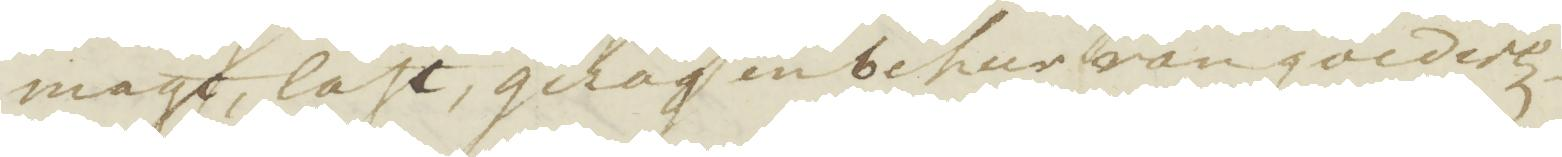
magt, last, gezag en beheer van goederen,
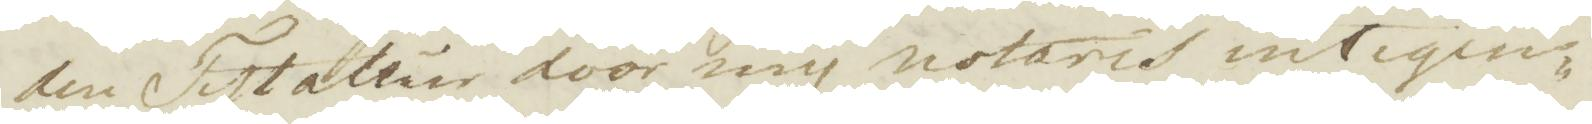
den Testateur door my notaris integen„
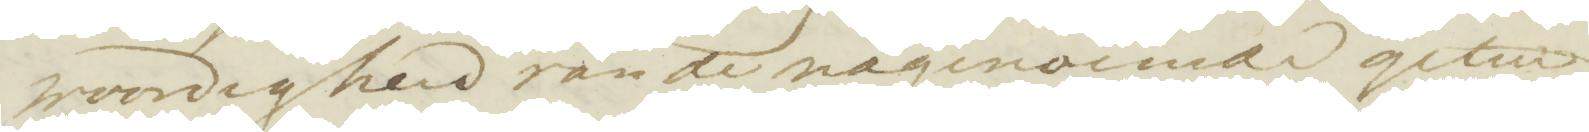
woordigheid van de nagenoemde getui
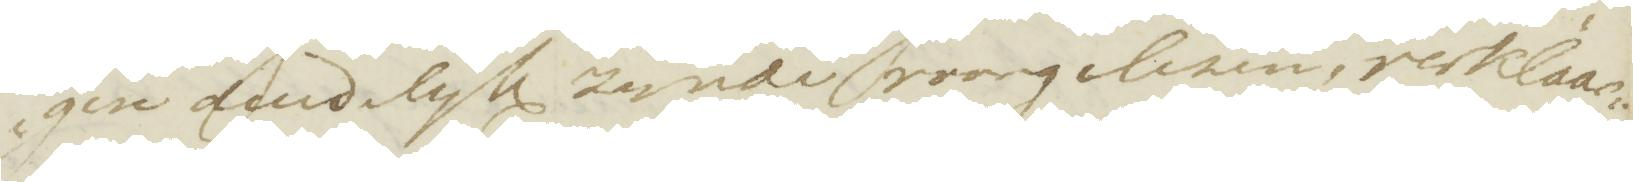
„gen duidelyk zynde voorgelezen, verklaar„
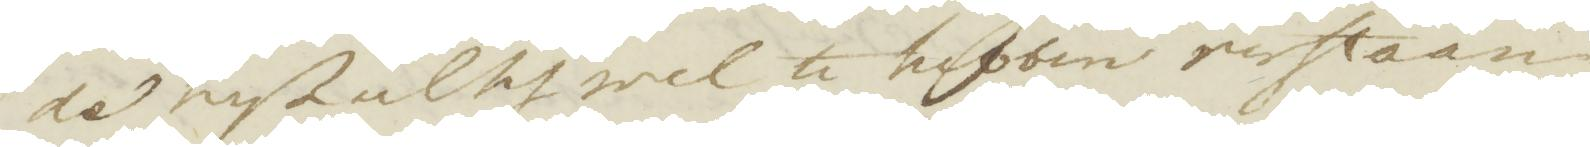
de hy zulks wel te hebben verstaan
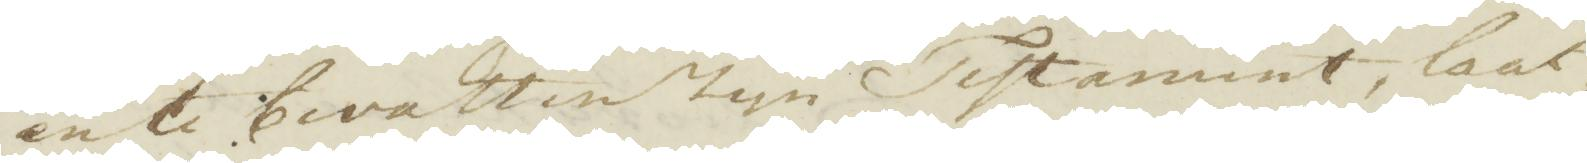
en te bevatten zyn Testament, laat
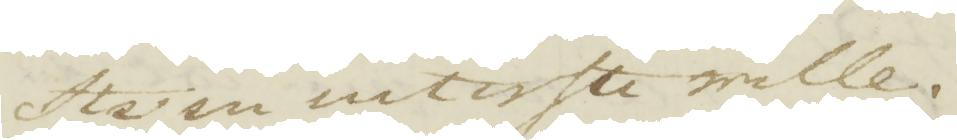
ste en uiterste wille.
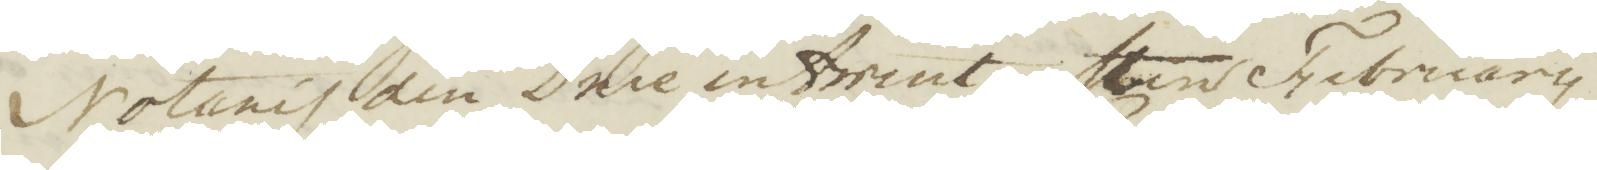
Notaris den Drie entwintigsten February
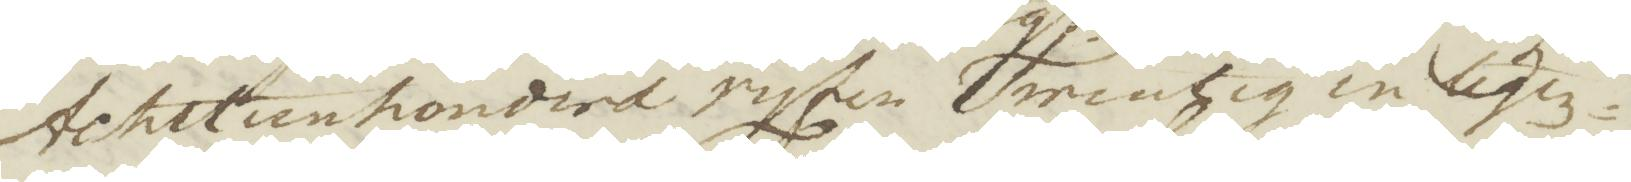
Achttienhonderd vyfen Twintig in tegen=
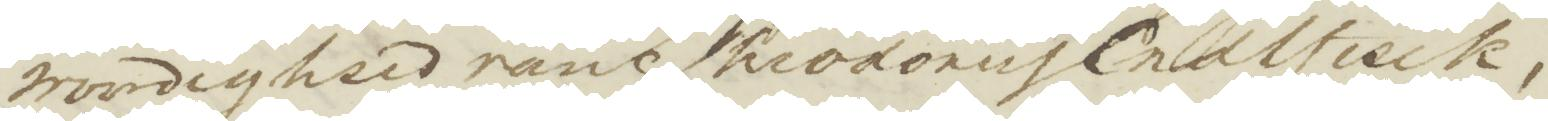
woordigheid van Theodorus Erdtsieck,
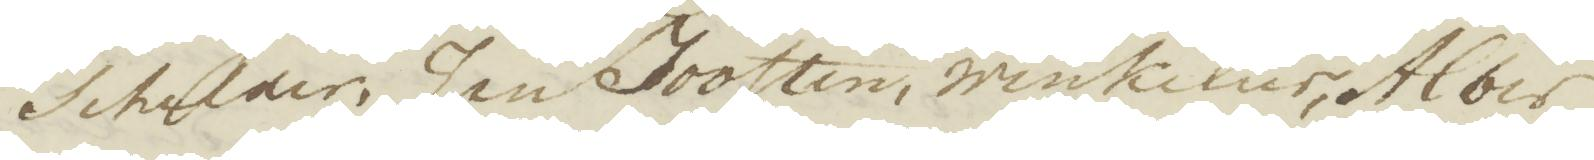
Schilder, Jan Ioosten, winkelier, Alber
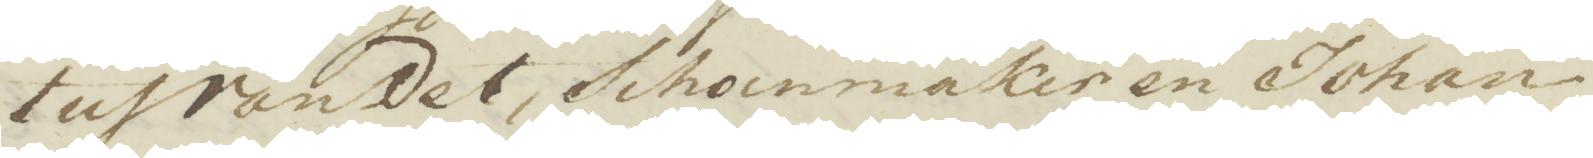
tus van Det, Schoenmaker en Iohan
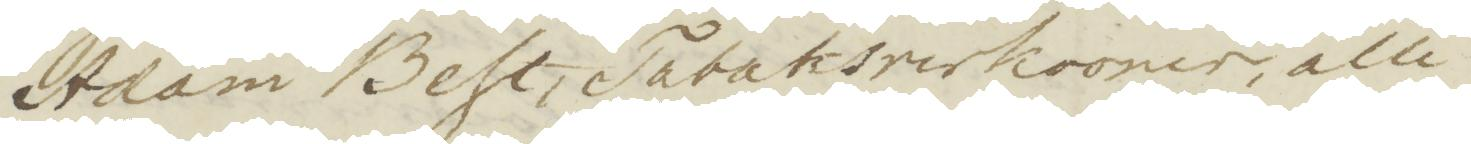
Adam Best, Tabaksverkooper, alle
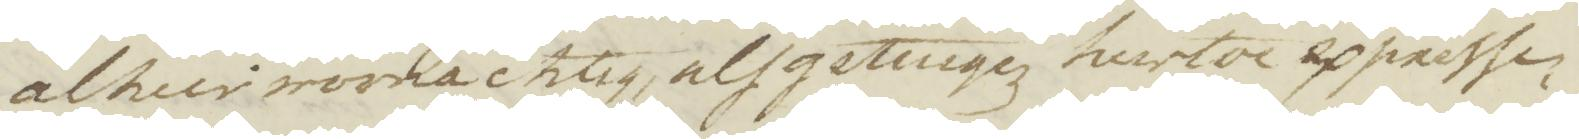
alhier woonachtig, als getuigen hiertoe expresse„
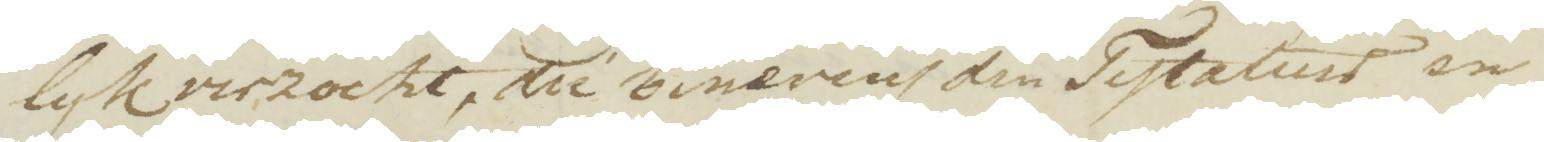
lyk verzocht, die benevens den Testateur en
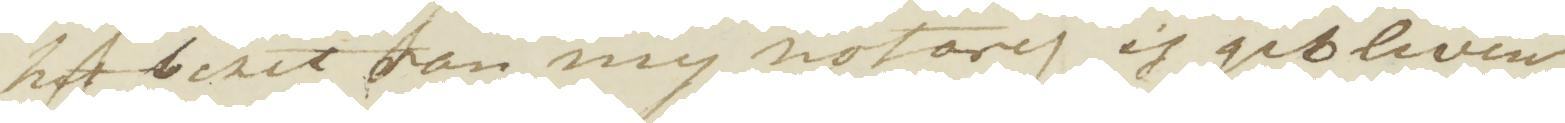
het bezit van my notaris is gebleven
